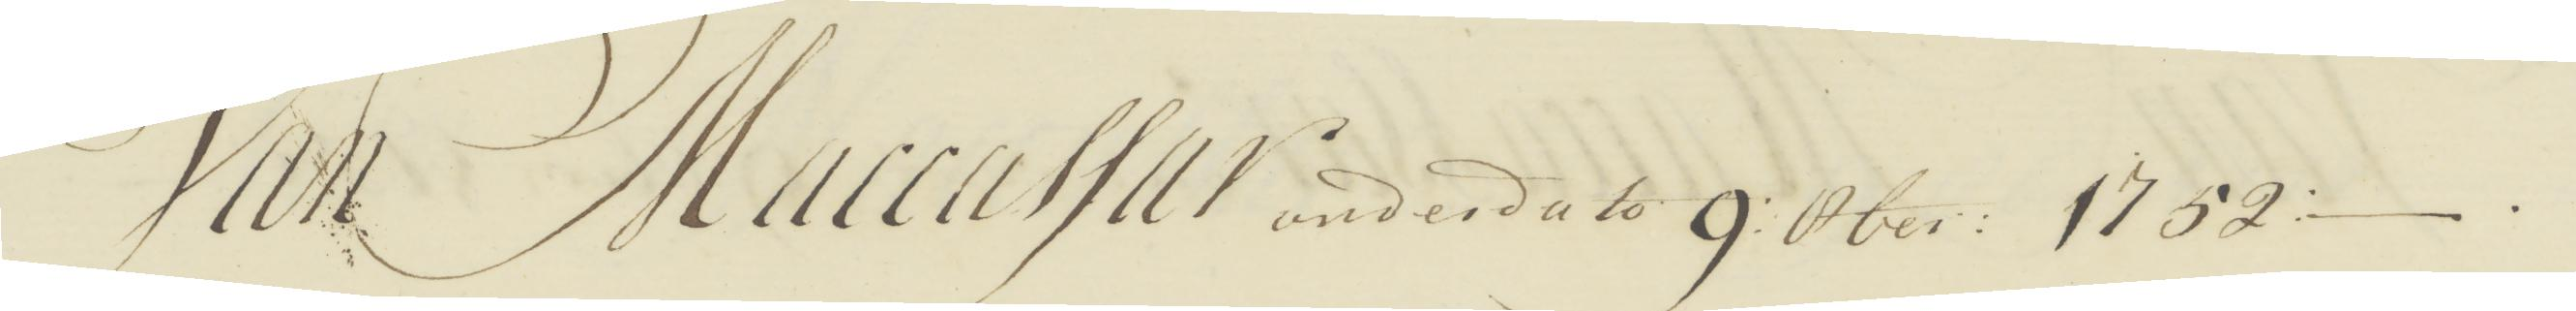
Van Maccassar onder dato 9: 8ber: 1752:—.
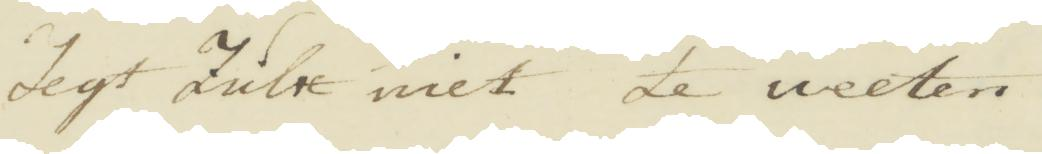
Zegt Zulx niet te weeten
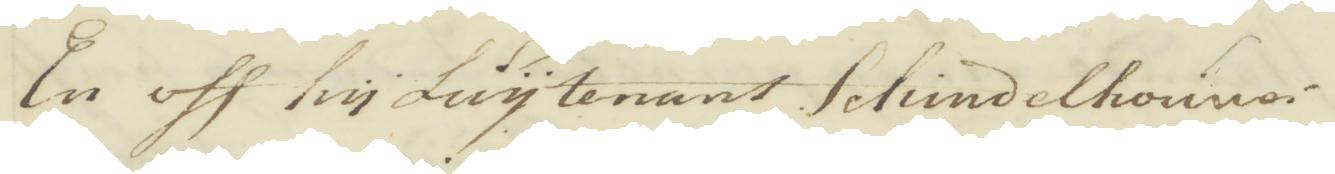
En off hij Luijtenant schindelhouwer
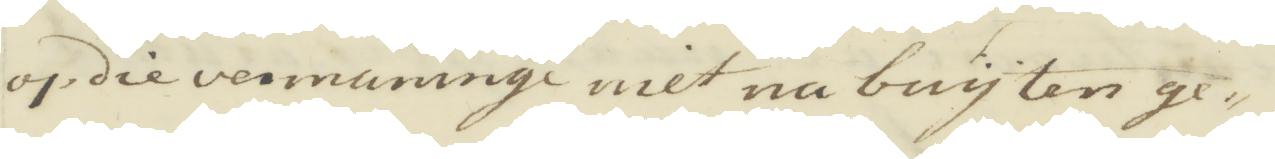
op die vermaninge niet na buijten ge„
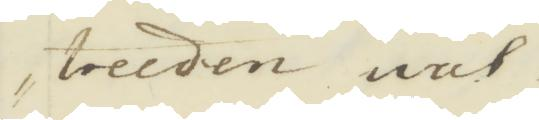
„treeden was
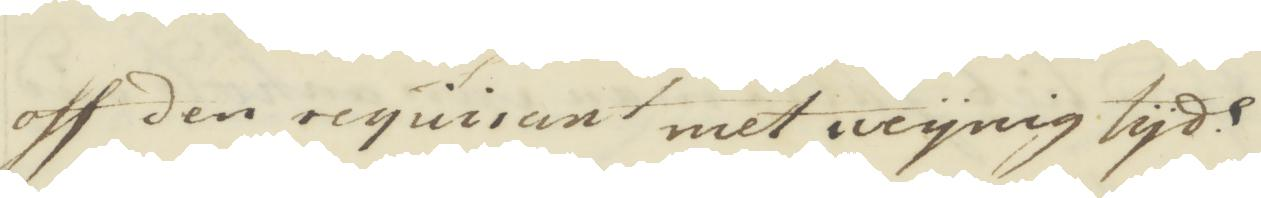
off den requirant niet weijnig tijd.s
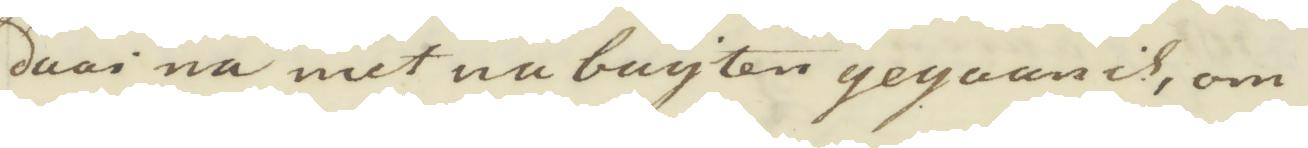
daar na niet na buijten gegaan is, om
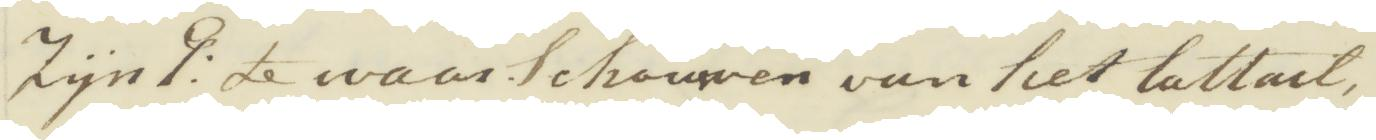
zijn G: te waarschouwen van het battail,
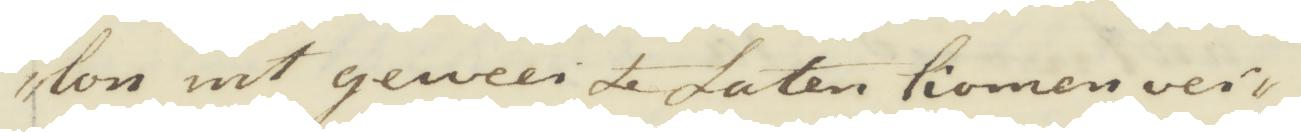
„lon int geweer te laten komen ver„
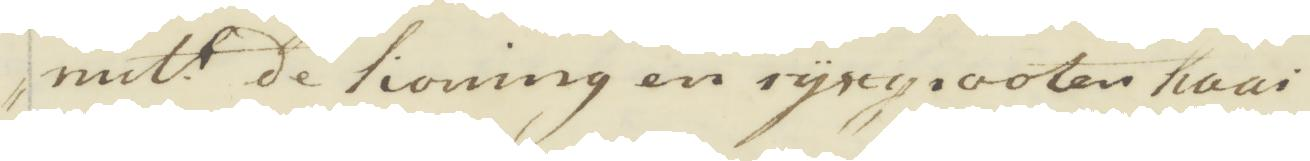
„mits de koning en rijxgrooten haar
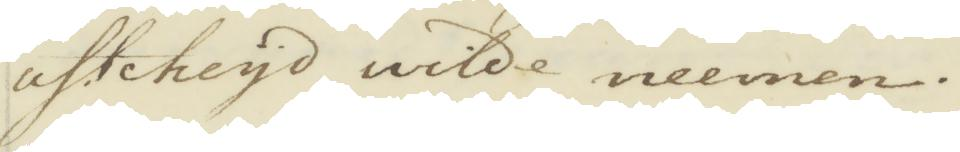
afscheijd wilde neemen.
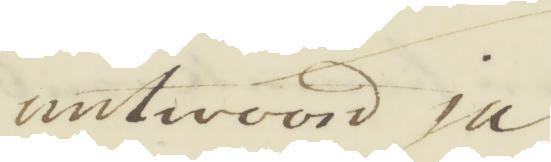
antwoord ja
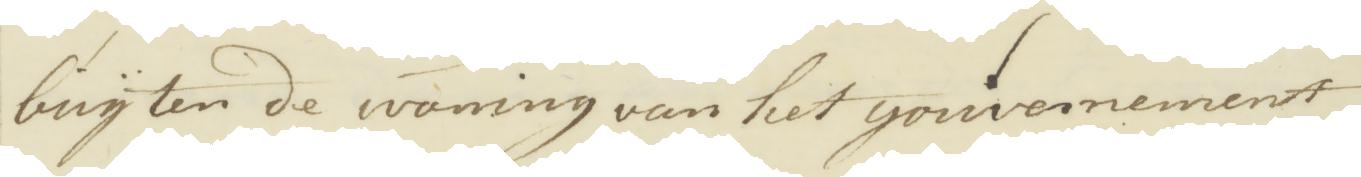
buijten de woning van het gouvernement
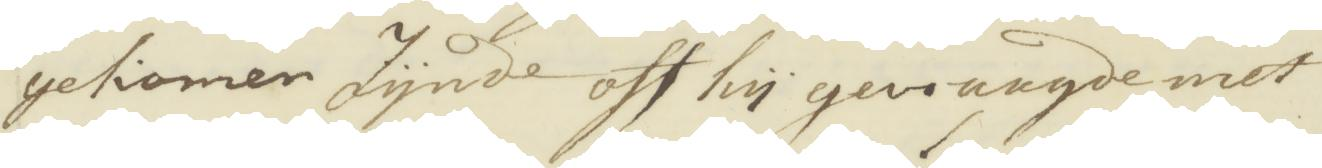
gekomen zijnde off hij gevraagde niet
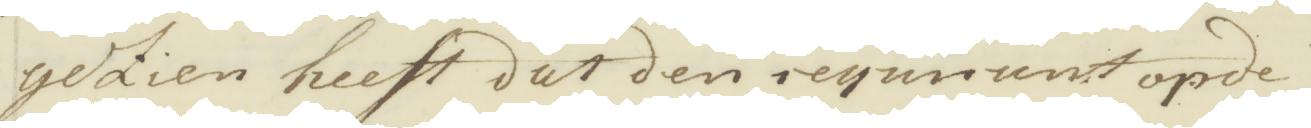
gezien heeft dat den requirant opde
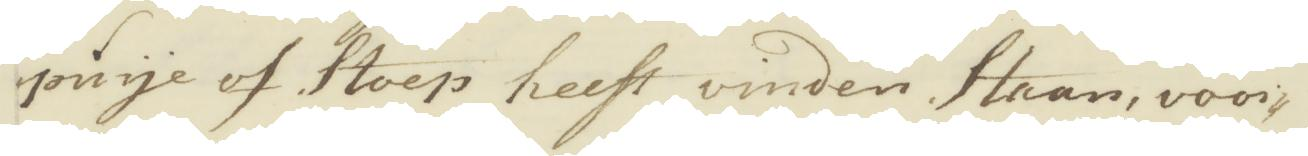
puije of stoep heeft vinden staan, voor„
